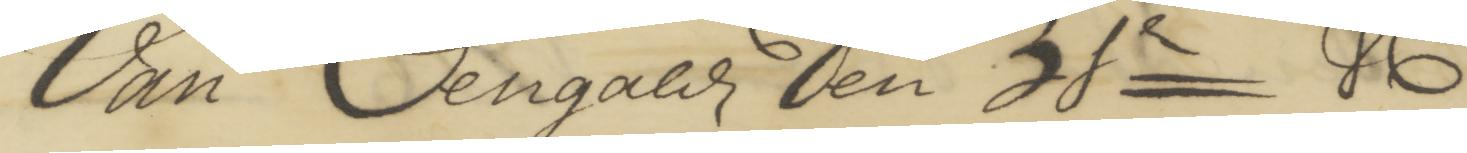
Van Bengalen den 38=en 8b=r 1716.
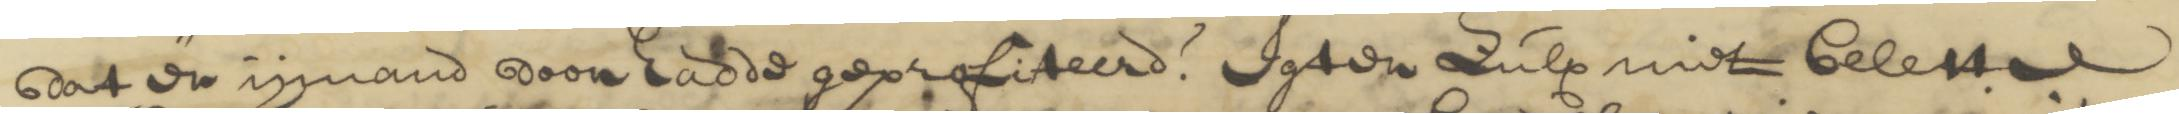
dat ër ijmand door hadde geprofiteerd: Egter zulx niet belette
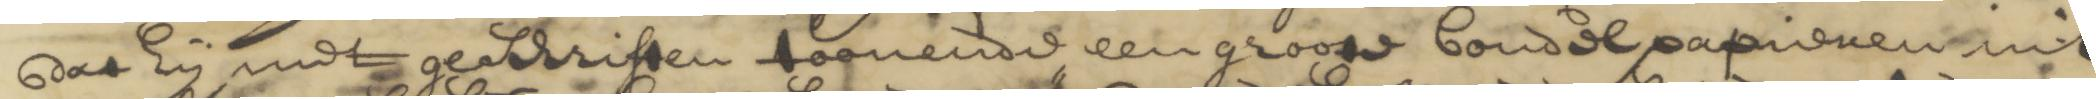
dat hij met geschriften toonende een groote bondel papieren in't
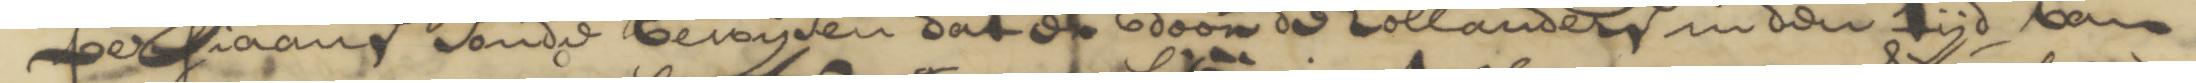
persiaans soude bewijsen dat op door de hollanders in den tijd van
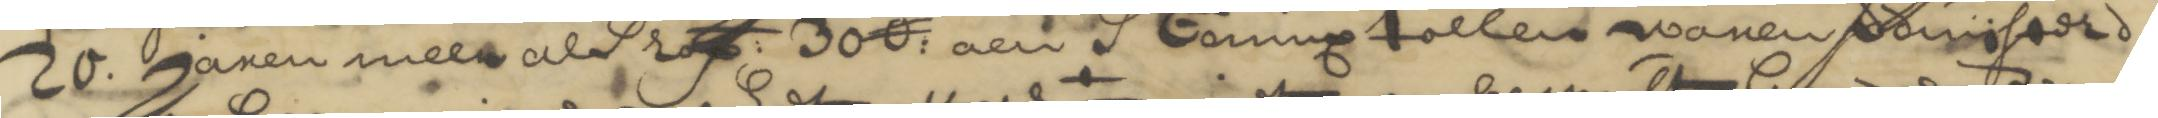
20. jaren meer als rop: 300: aen s'Coninx tollen waren verduijsterd
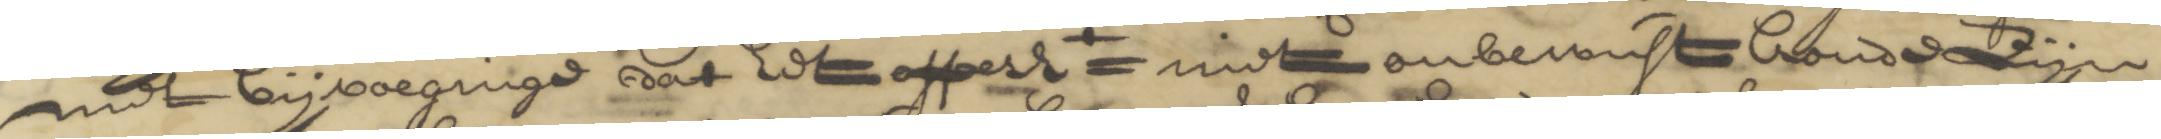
met bijvoeginge dat het opperh=t niet onbewust konde zijn
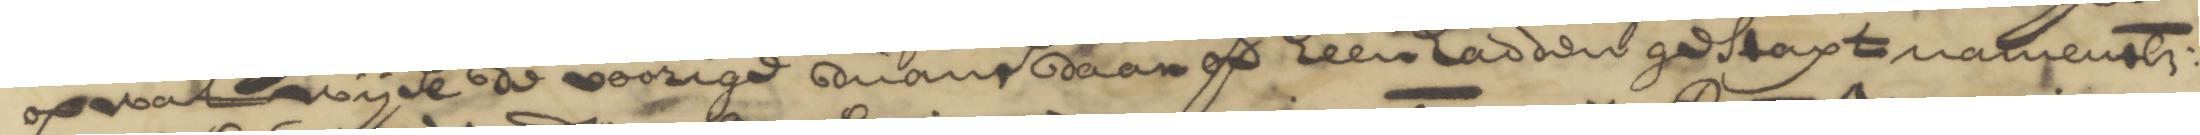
opwat wijse de voorige duans daar over heen hadden gestapt namentlijk
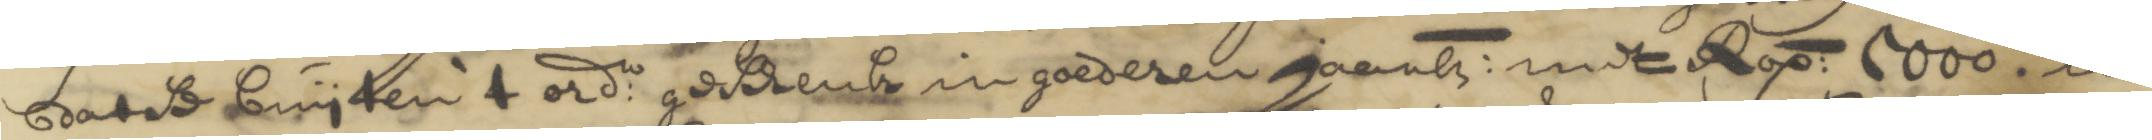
dat se buijten 't ord:r geschenk in goederen jaarlijk met Rop: 5000. in
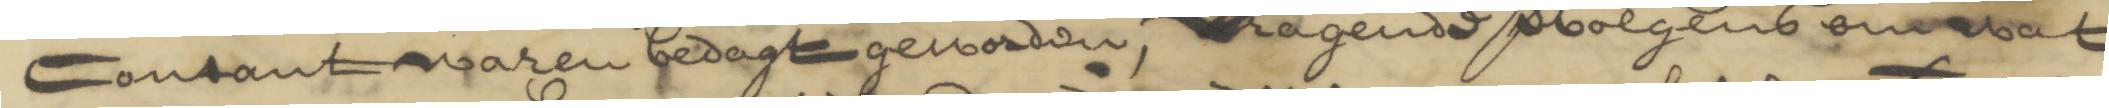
contant waren bedagt geworden, vragende vervolgens om wat
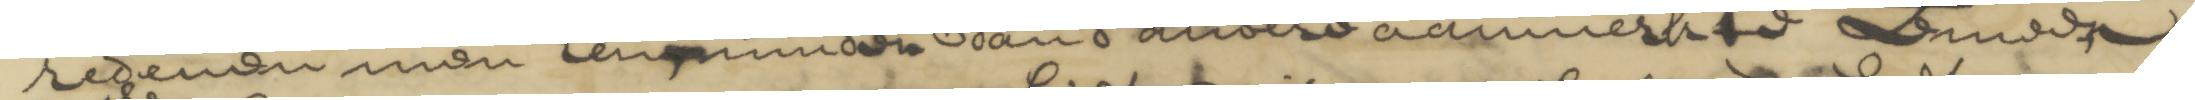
redenen men hem minder dan d'andere aanmerkte temeer
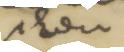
^ hen
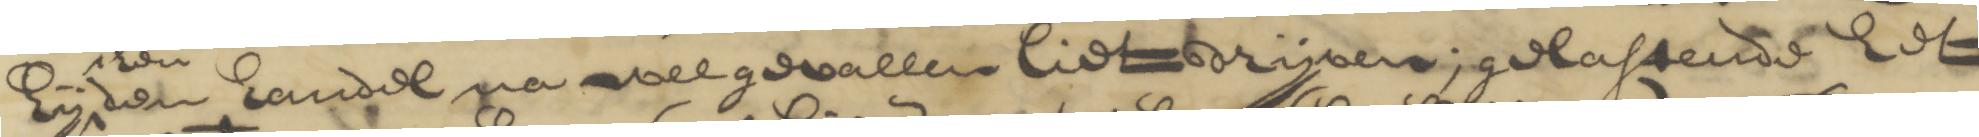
hij ^ den handel na wel gevallen liet drijven; gelastende het
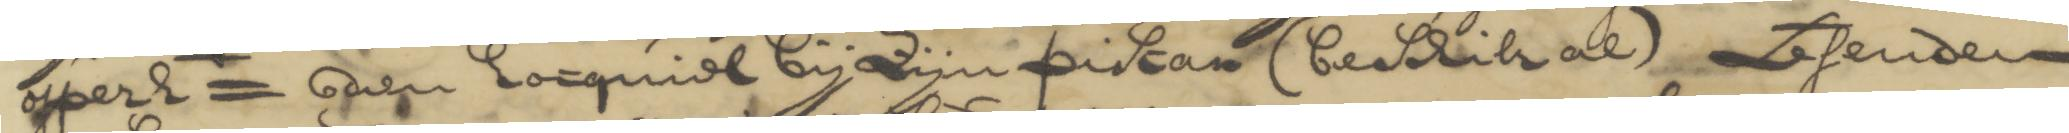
opperh=t den hocquiel bij zijn piscar (beschik al) tesenden
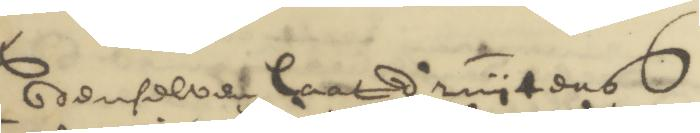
denselver laat d’ruijters
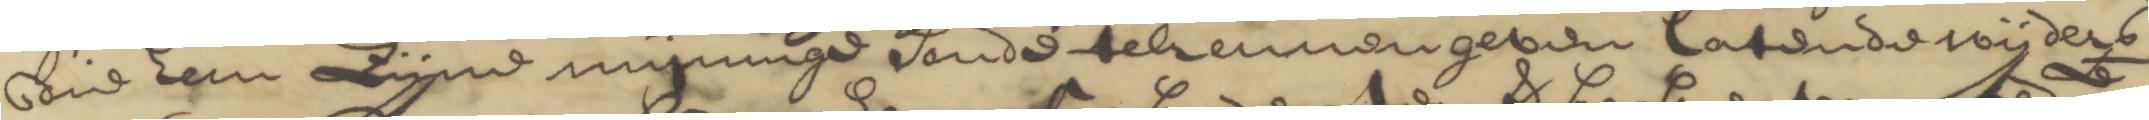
die hem zijne mijninge soude tekennen geven latende wijders
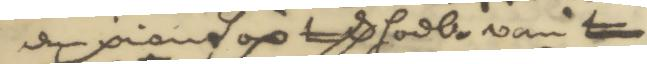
en pions op’t versoek van’t
